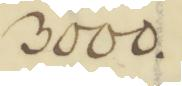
3000.
